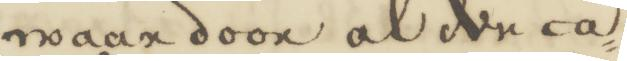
waar door al den ca„
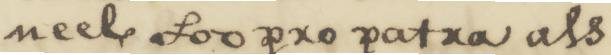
neel soo pro patra als
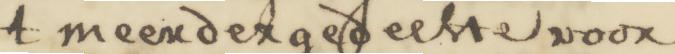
t meerder gedeelte voor
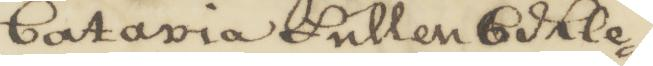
batavia sullen bekle
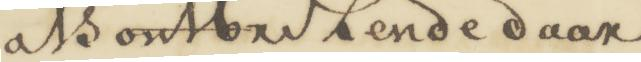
als ontbrekende daar
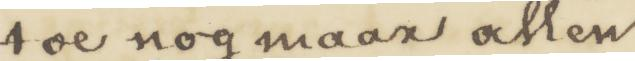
toe nog maar allen
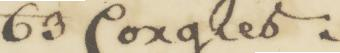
63. Corgies.
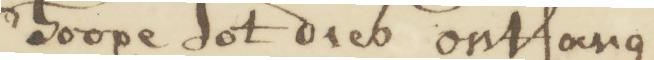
hoope tot dies ontfang
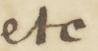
etc
